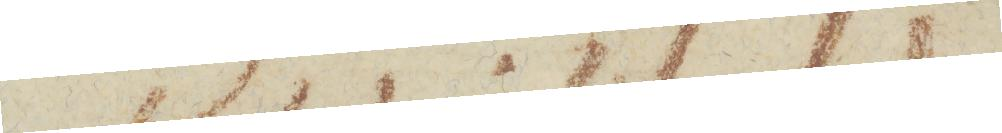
1771/72. 1772/73
